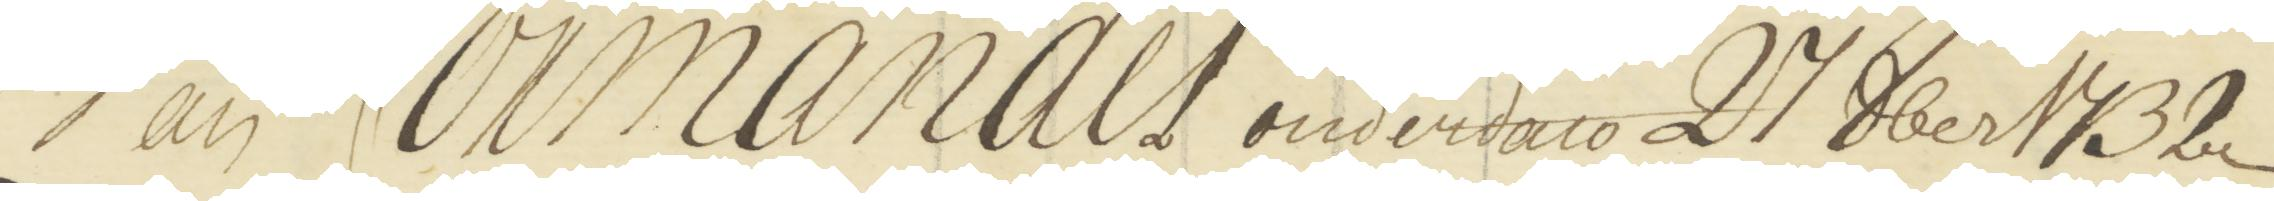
Van Cormandel onder dato 27 8ber 1732
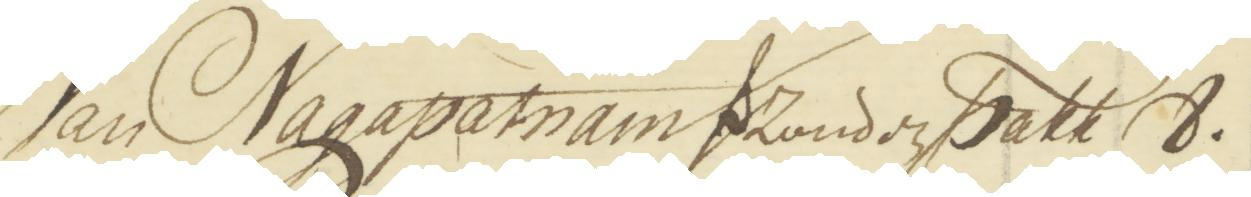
Van Nagapatnam verzonden pakk 8.
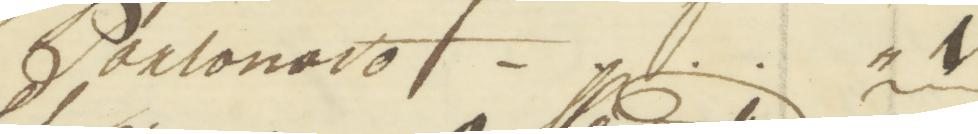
Portonovo - - . . „ 1
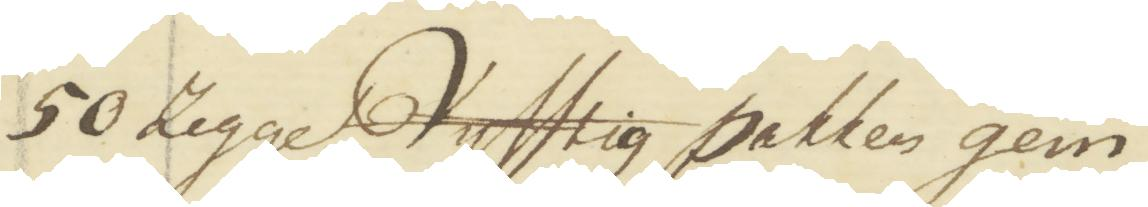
50 zegge Vyfftig pakken gem
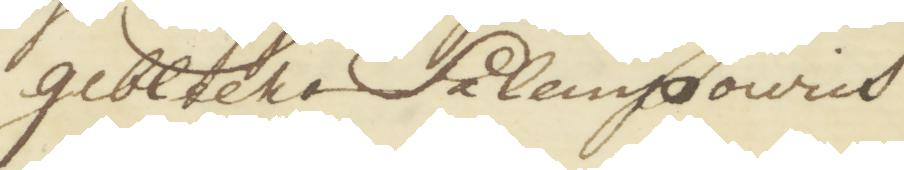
gebleekt Salempouris
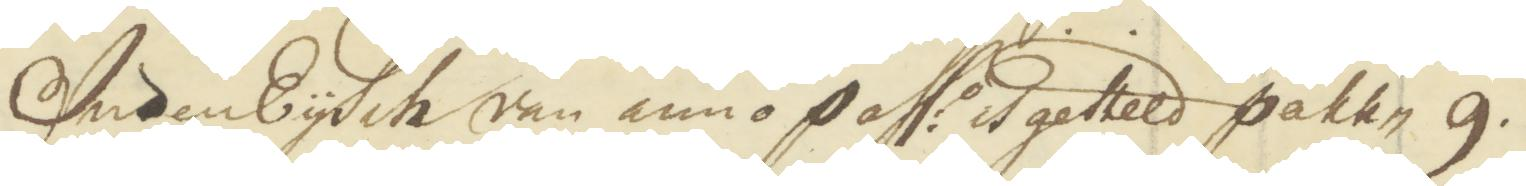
In den Eijsch van anno pass:o is gesteld pakk„ 9.
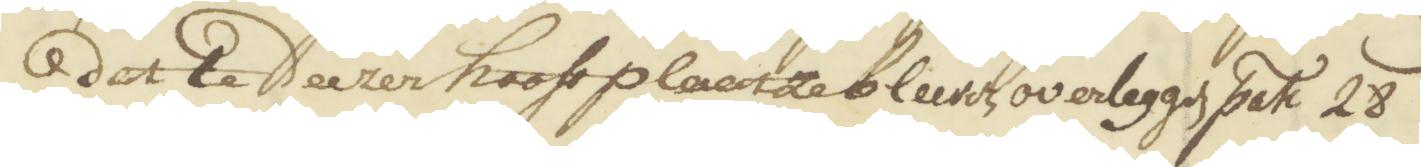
dat te deezer hooft plaatze bleeven overleggen pak 28
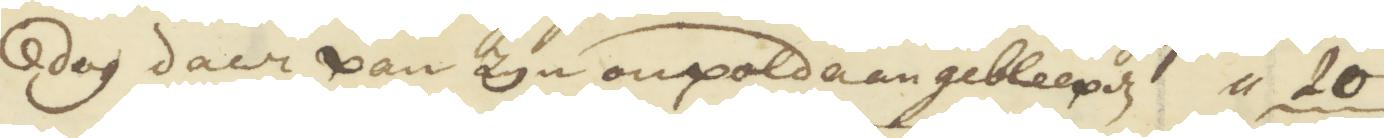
dog daer van zyn onvoldaan gebleeven „ 20
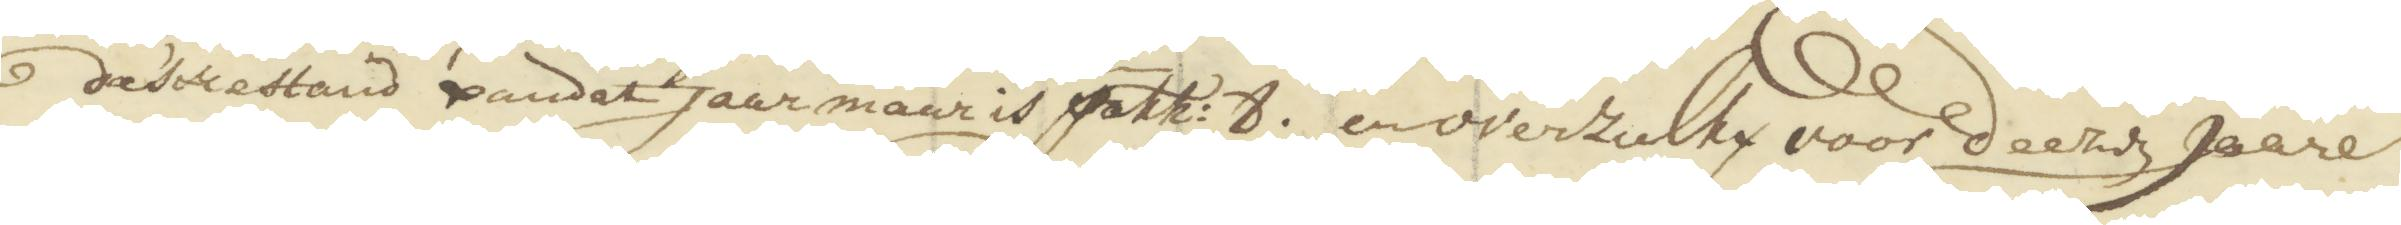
daescrestand van dat Jaar maar is pakk: 8. en overzulkx voor deezen Jaare
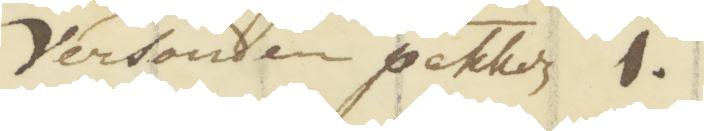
Versonden pakken 1.
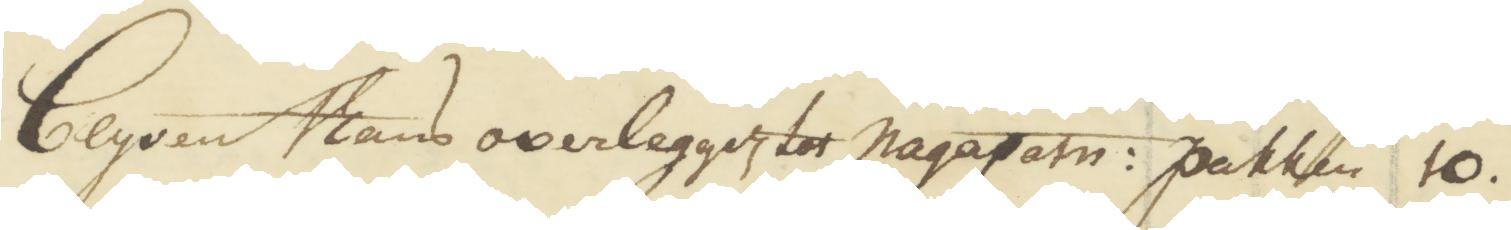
blyven thans overleggen tot nagapatn: pakken 10
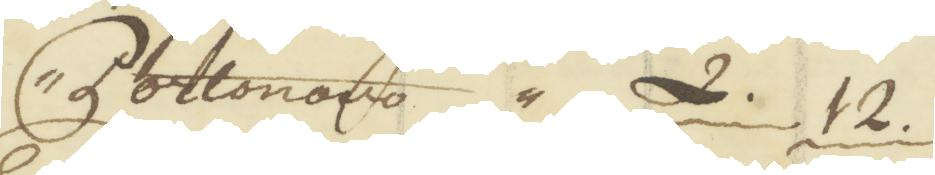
„ Portonovo „ 2. 12.
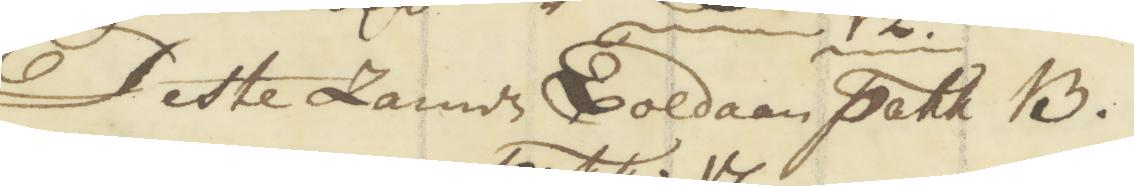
Destezamen voldaan pakk 13.
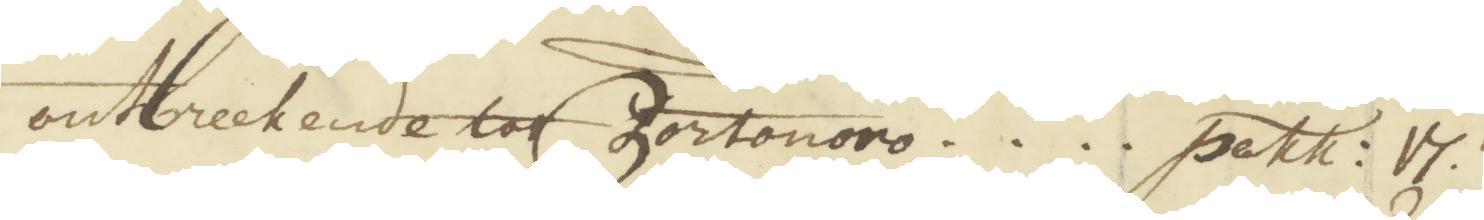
ontbreekende tot Portonovo . . . . pakk: 17.
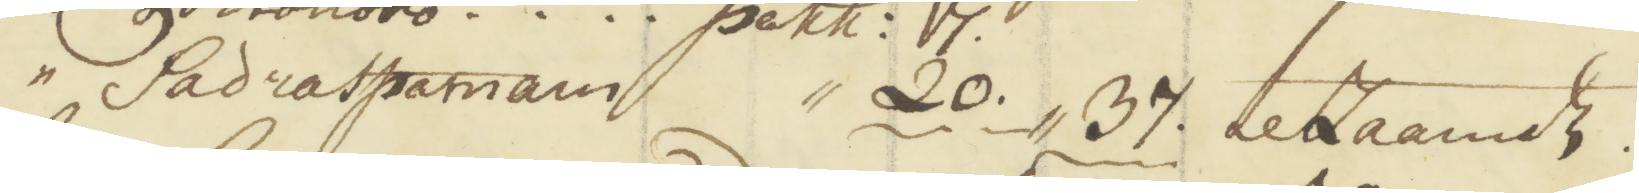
„ Sadraspatnam „ 20. „ 37. tezaamen
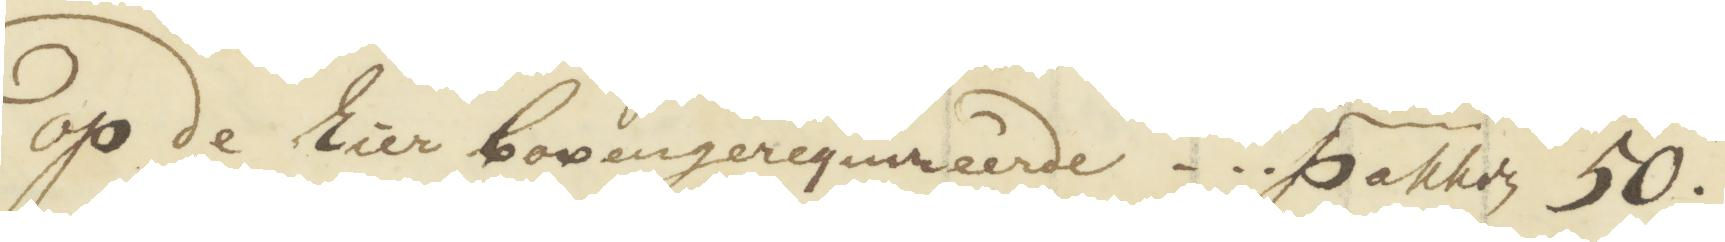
op de hier bovengerequireerde - . . pakken 50.
